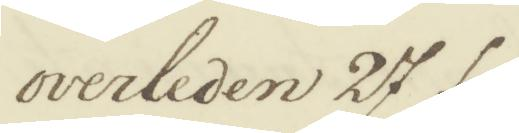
overleden 27 fe
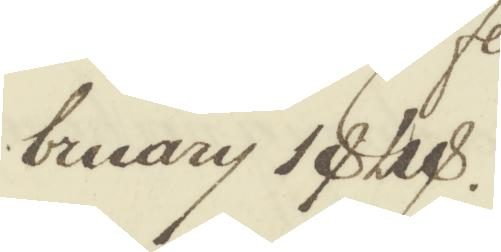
bruary 1848.
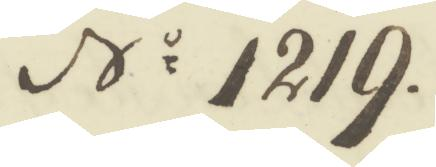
N=o 1219.
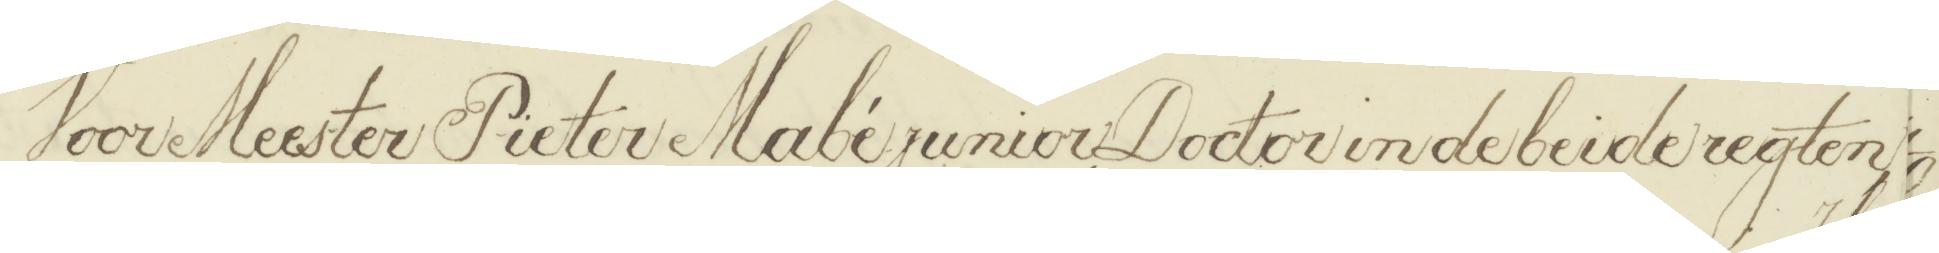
Voor Meester Pieter Mabé junior, Doctor in de beide regten
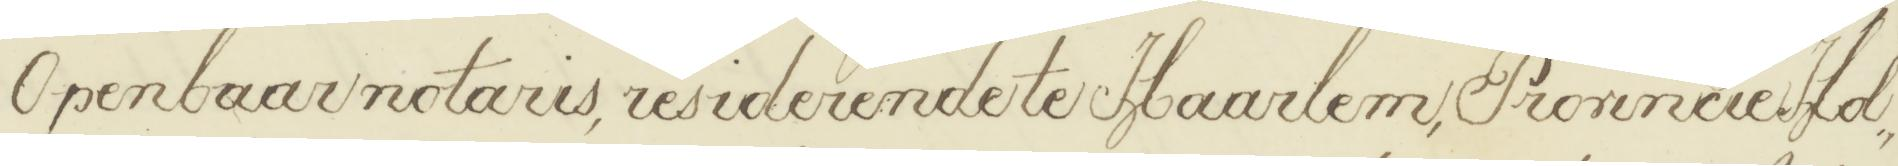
Openbaar notaris, residerende te Haarlem, Provincie Hol„
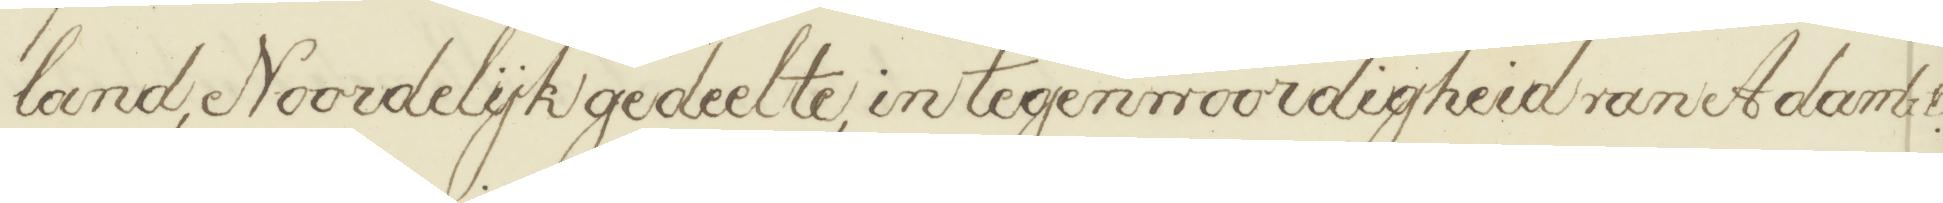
land, Noordelijk gedeelte, in tegenwoordigheid van Adam
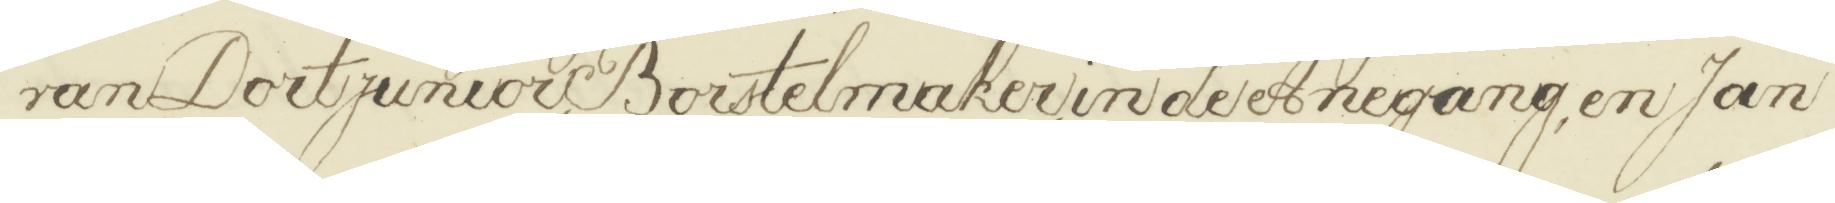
van Dort junior, Borstelmaker, in de Anegang, en Jan
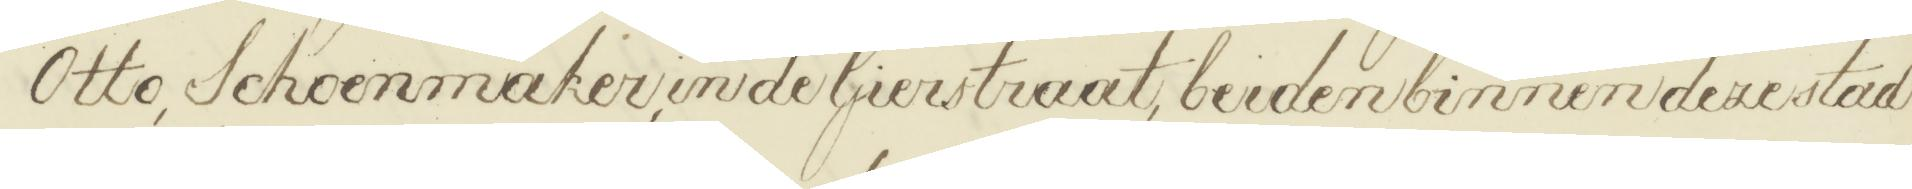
Otto, Schoenmaker, in de Gierstraat, beiden binnen deze stad
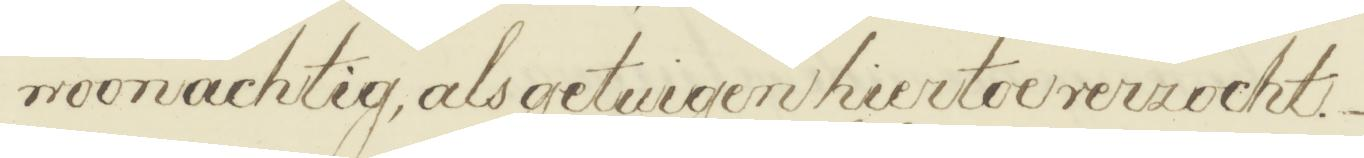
woonachtig, als getuigen hier toe verzocht.
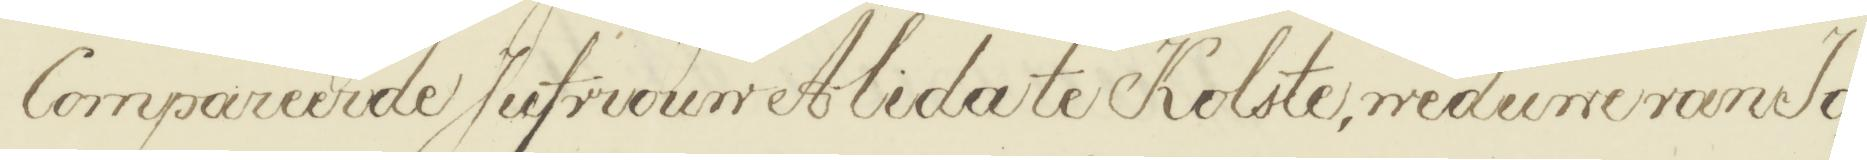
Compareerde Jufvrouw Alida te Kolste, weduwe van Io
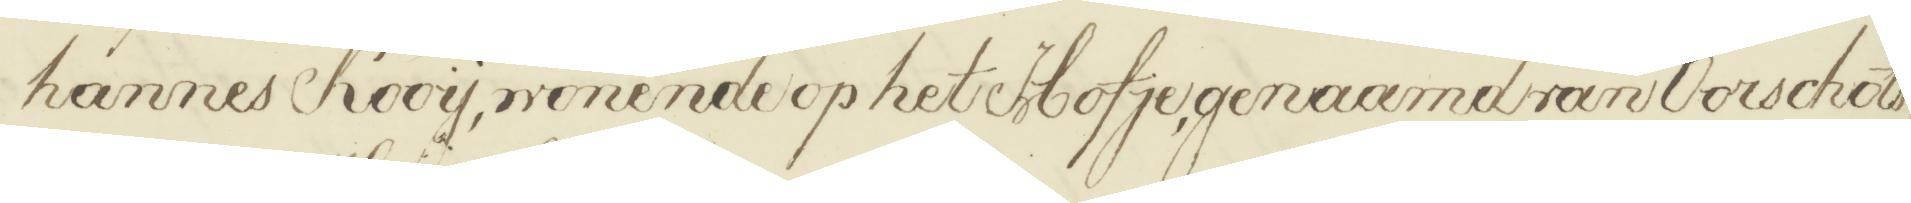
hannes Kooij, wonende op het Hofje, genaamd van Oorschots
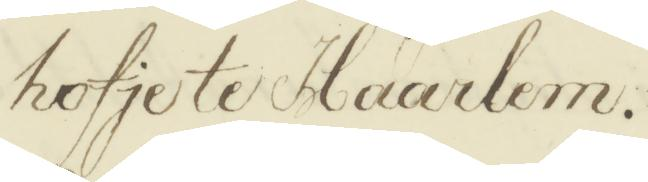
hofje te Haarlem.
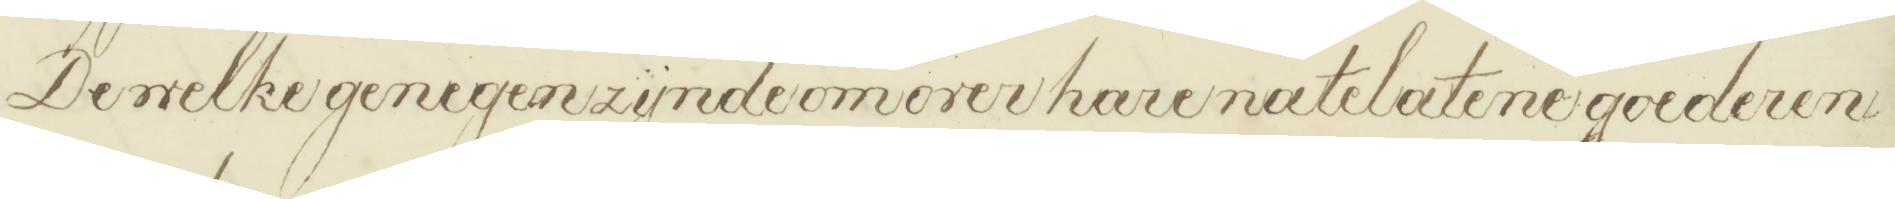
Dewelke genegen zijnde om over hare natelatene goederen
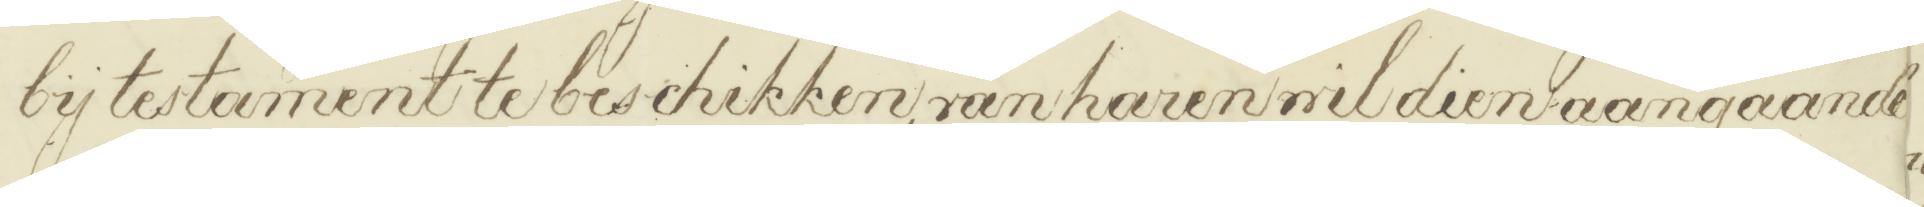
bij testament te beschikken, van haren wil dien aangaande
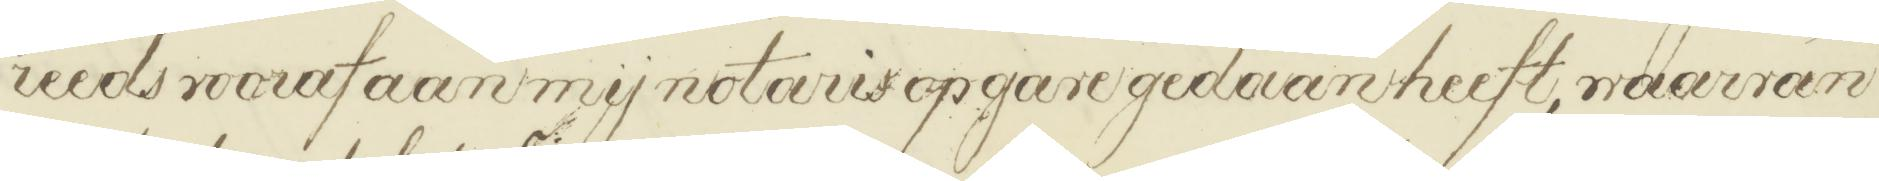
reeds vooraf aan mij notaris op gave gedaan heeft, waarvan
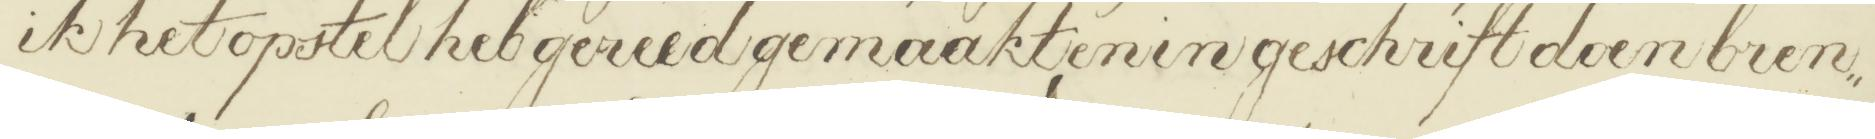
ik het opstel heb gereed gemaakt en in geschrift doen bren„
